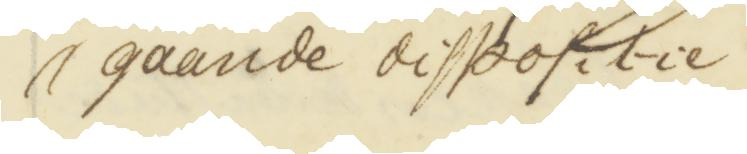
„gaande dispositie
